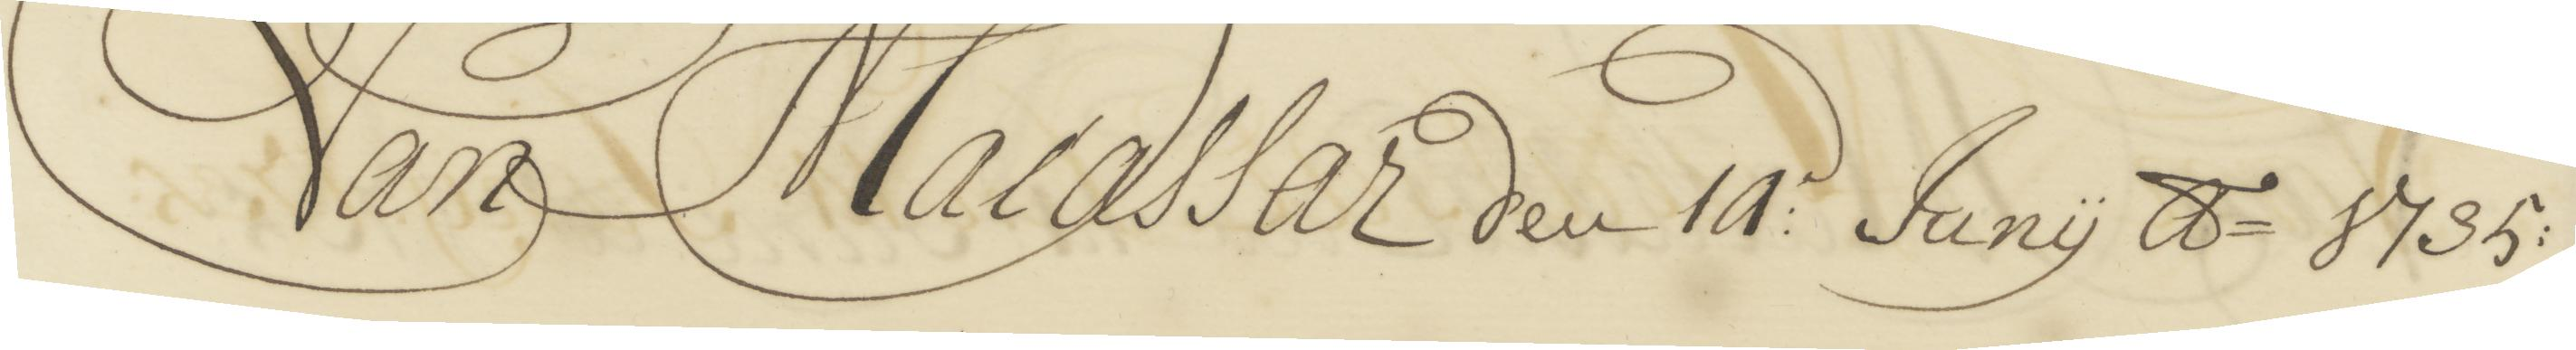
Van Macassar den 14:' Iunij A=o 1735:
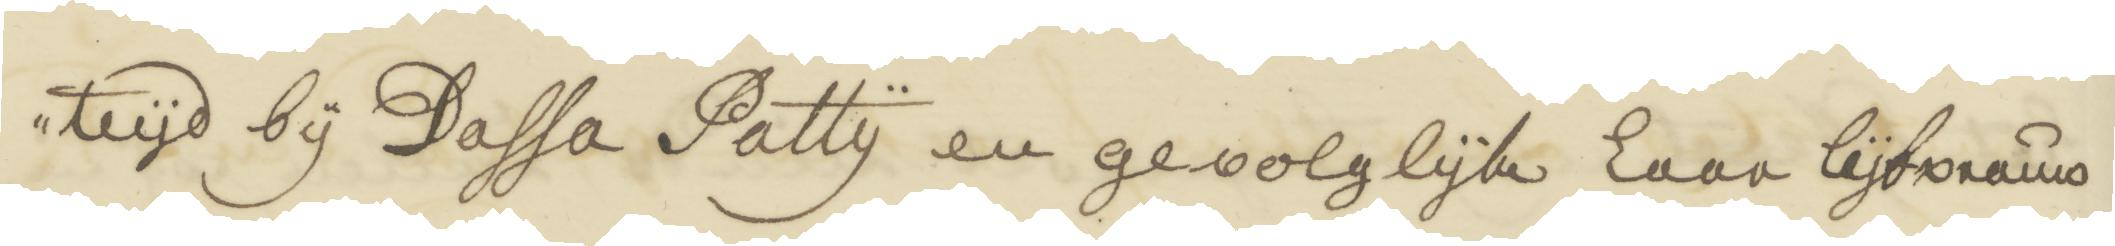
„teijd bij Dassa Pattij en gevolglijk haar lijfvrouw
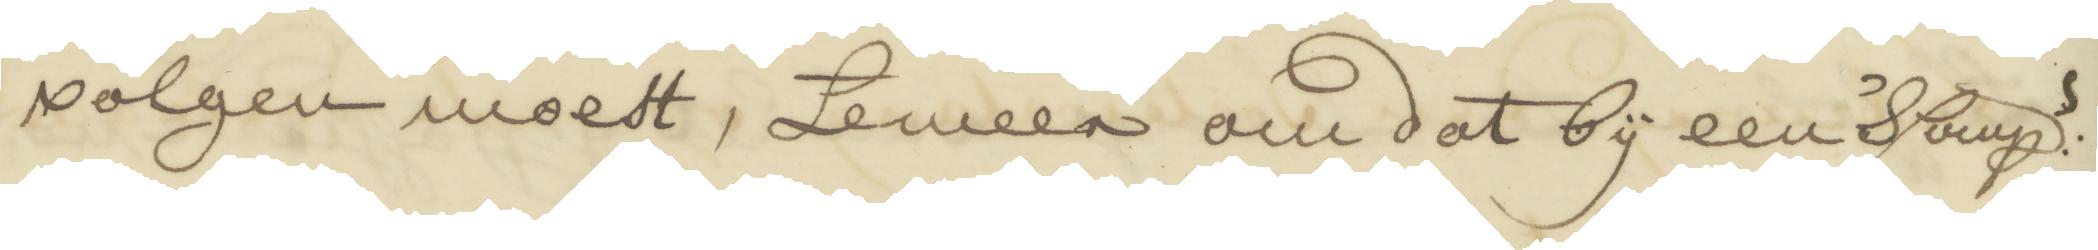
volgen moest, temeer om dat bij een 'sComp:s
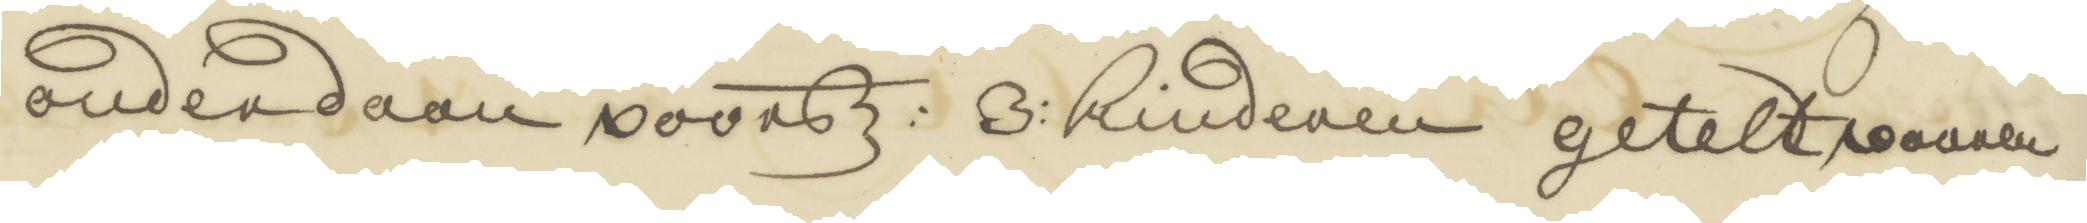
onderdaan voorsz: 3: kinderen getelt waaren
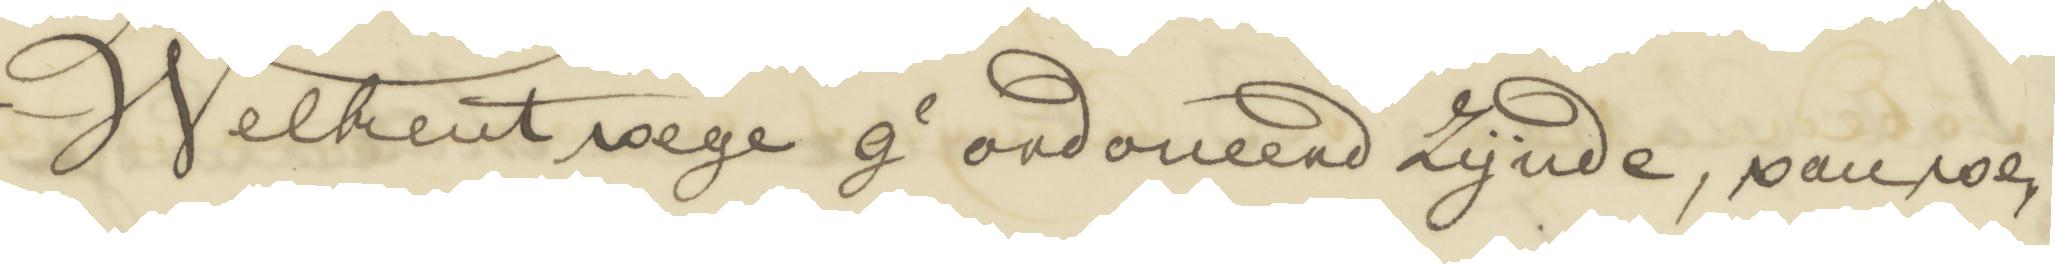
Welkent wege g’ordoneerd zijnde, van we„
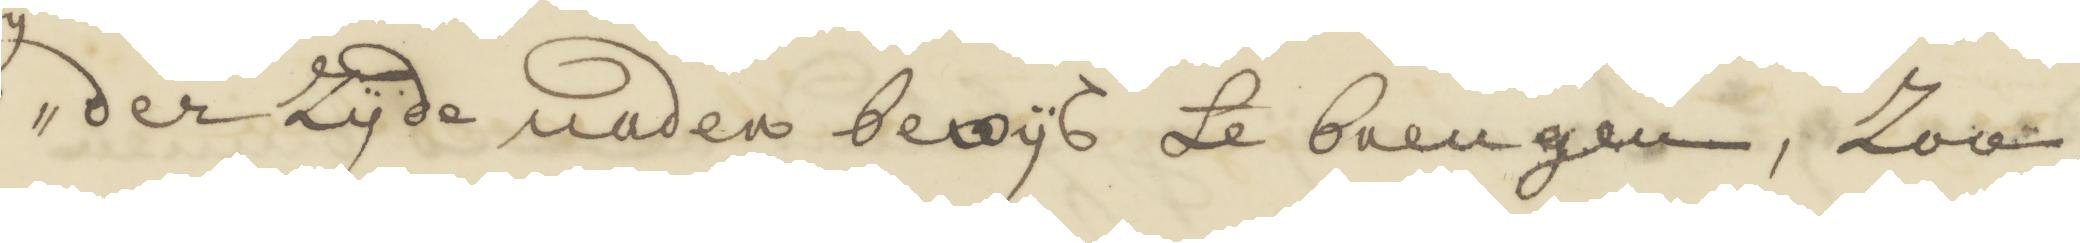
„der zijde nader bewijs te brengen, zoo
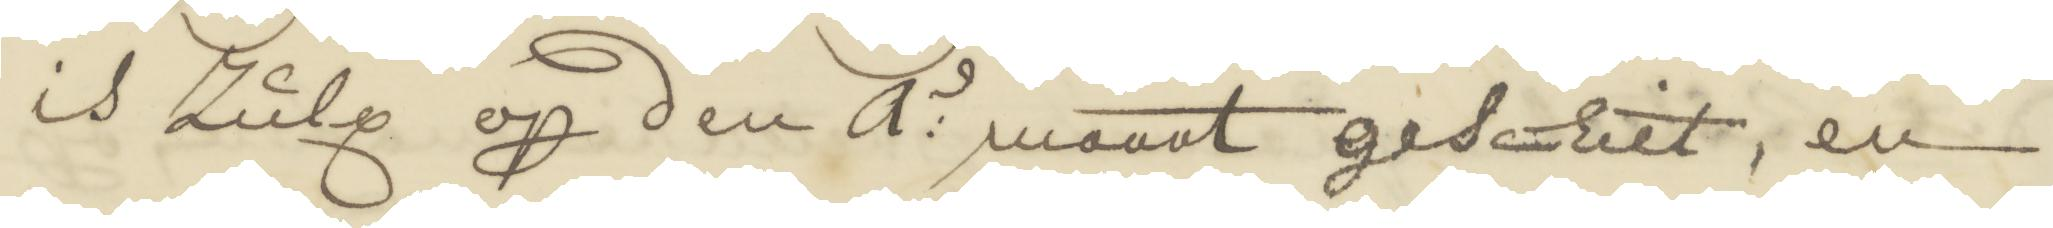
is zulx op den 4:e maart geschiet, en
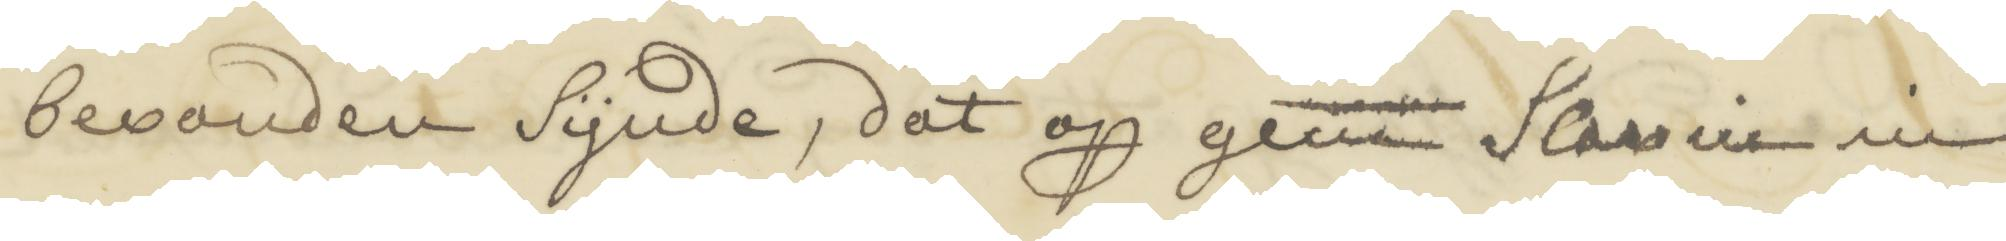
bevonden sijnde, dat op gem slavin in
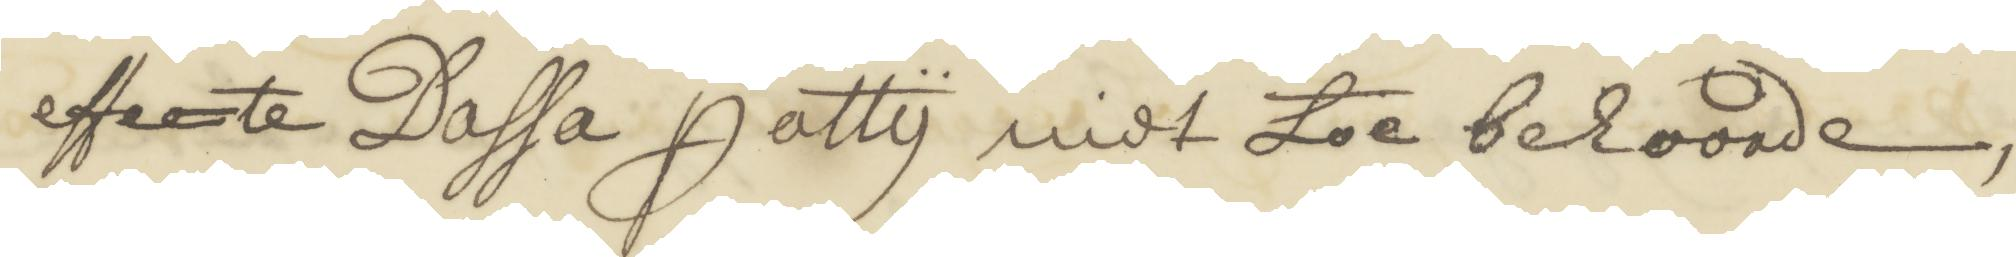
effecte Dassa Pattij niet toe behoorde,
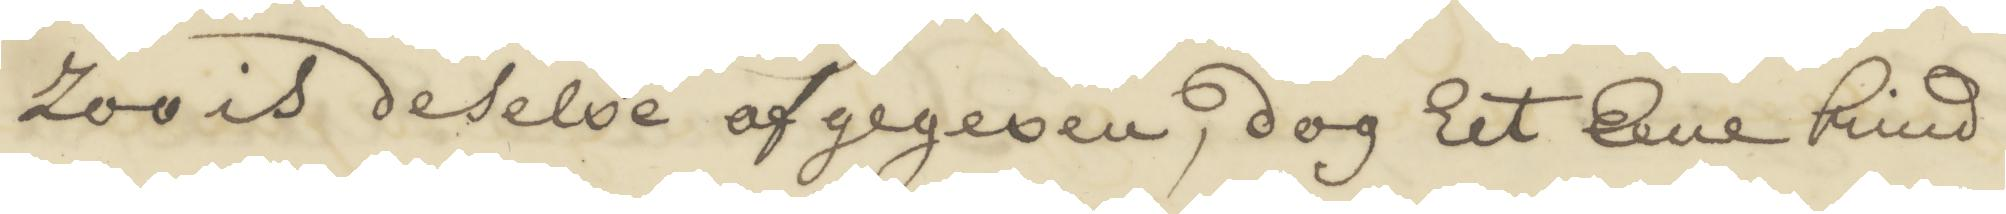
zoo is deselve afgegeven, dog het Eene kind
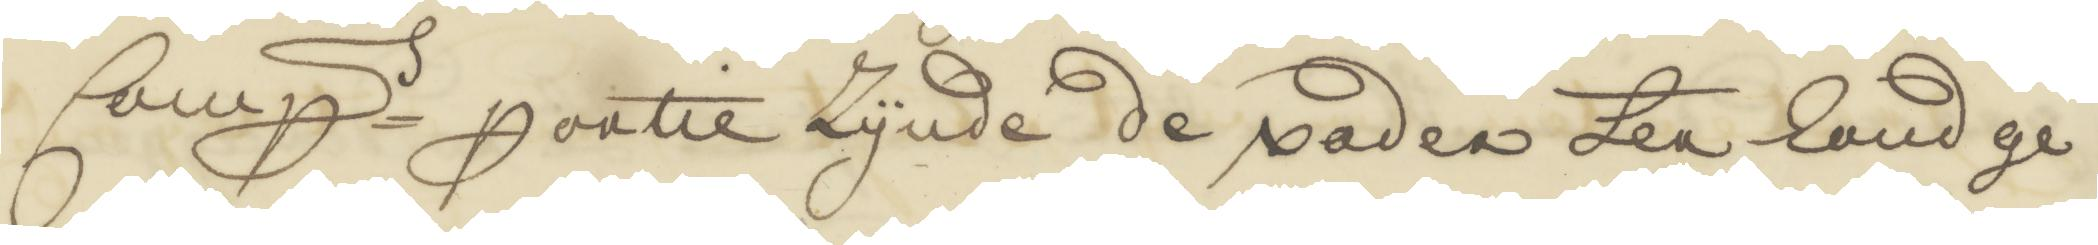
Comp=s portie zijnde de vader ter hand ge
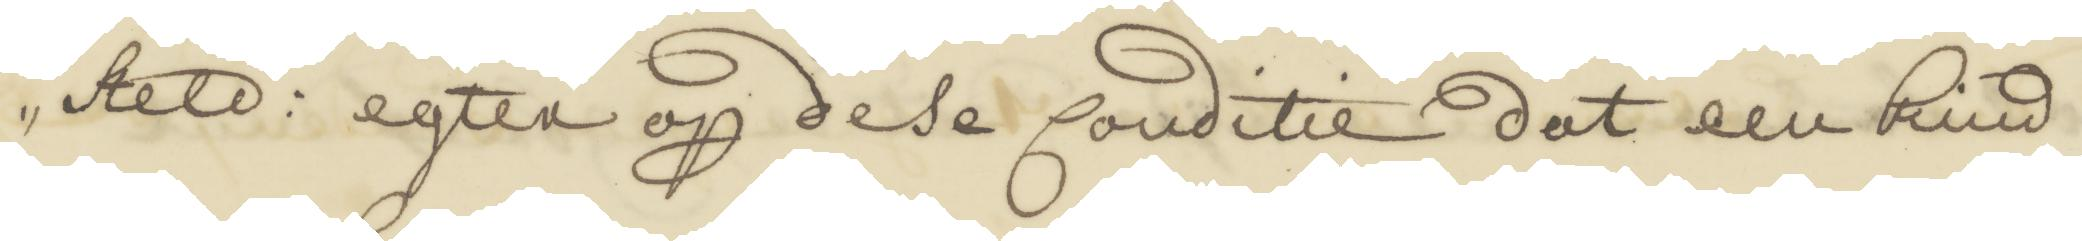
„steld: egter op dese conditie dat een kind
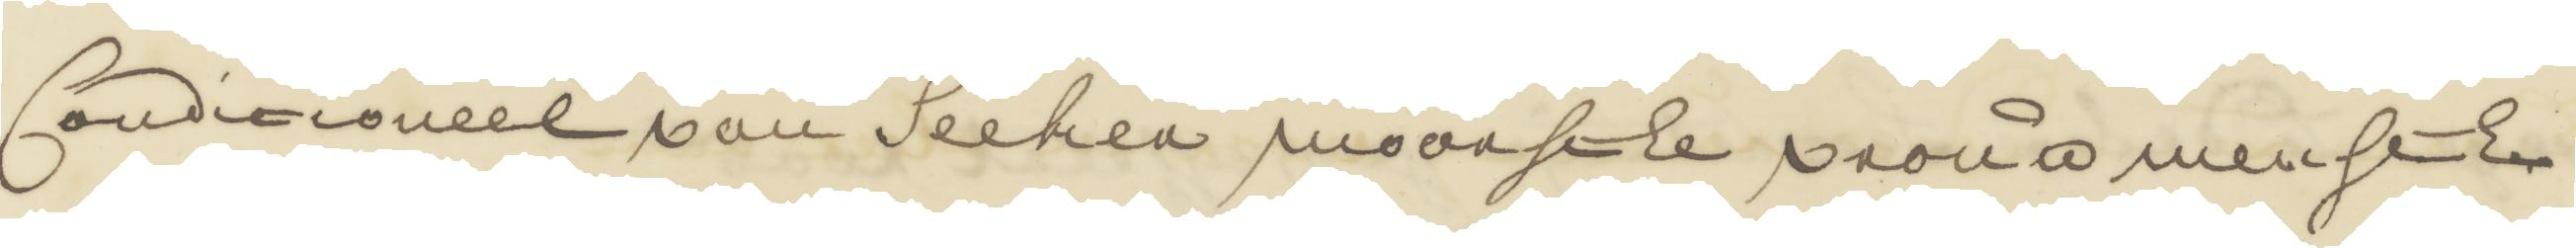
Condicioneel van seeker moorsche vrouw mensch
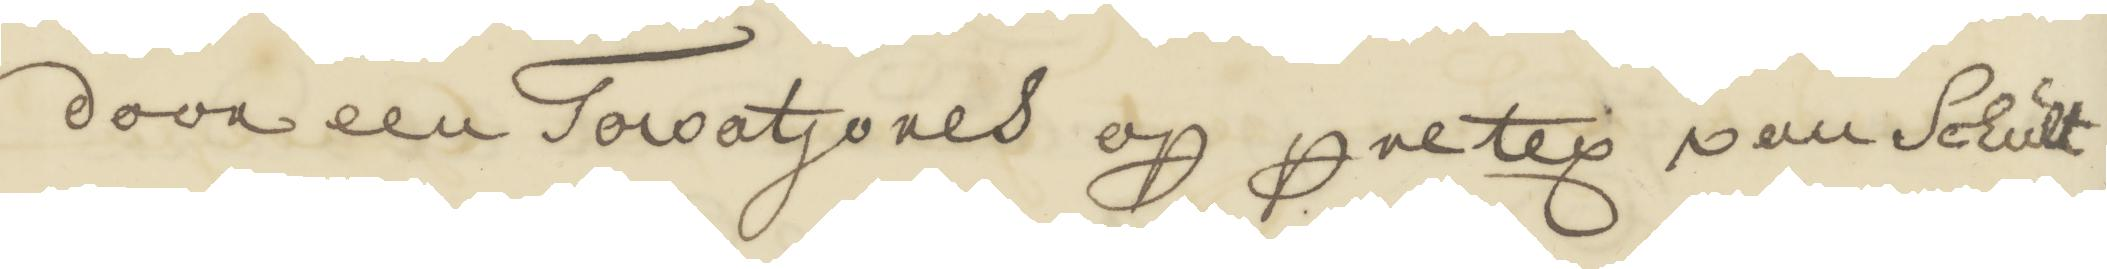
door een Towatjores op pretex van schult
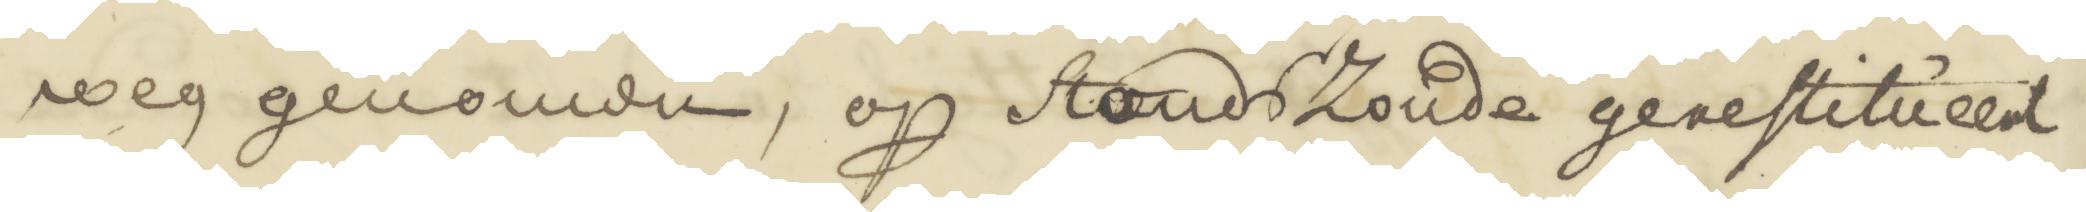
weg genomen, op stonds zoude gerestitueert
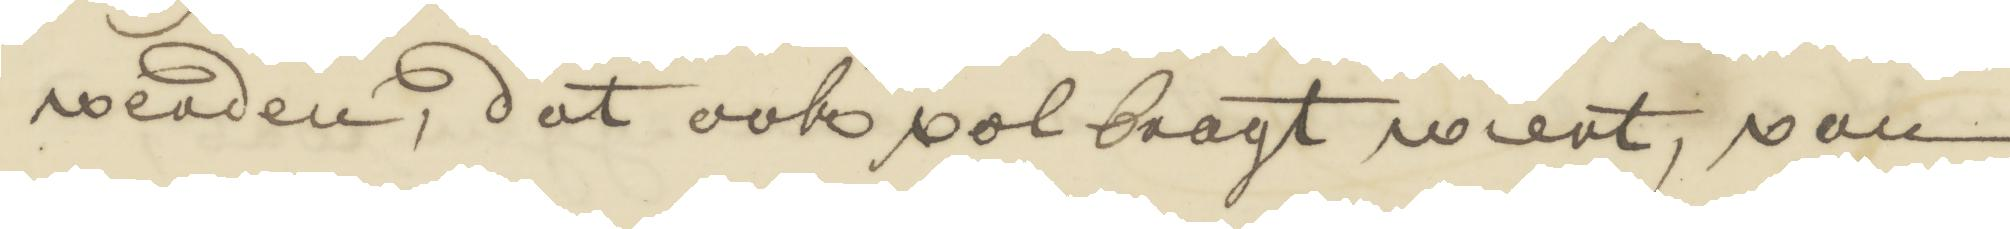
werden, dat ook volbragt wiert, van
